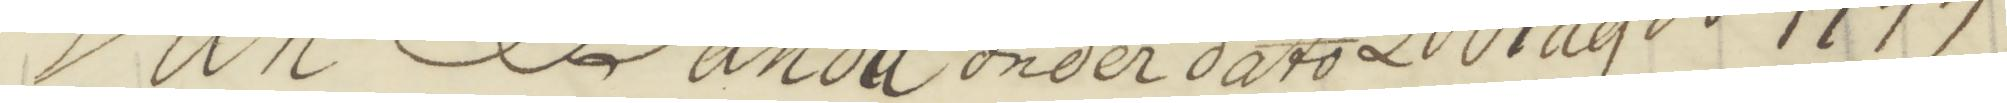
Van Banda onder dato 20 Augus 1749
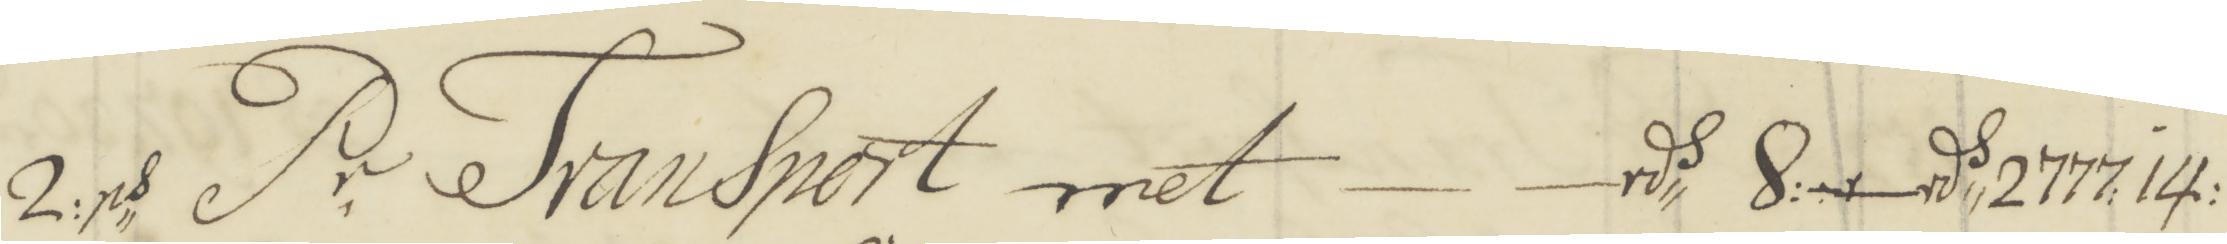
2:p„s P,r Transport met rd„s 8: —„ rd„s 2777:14:
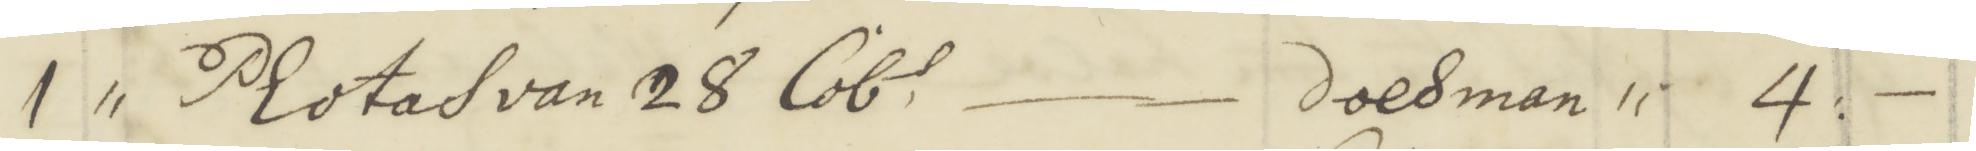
1 „ Photas van 28 Cob,s doesman „ 4:—
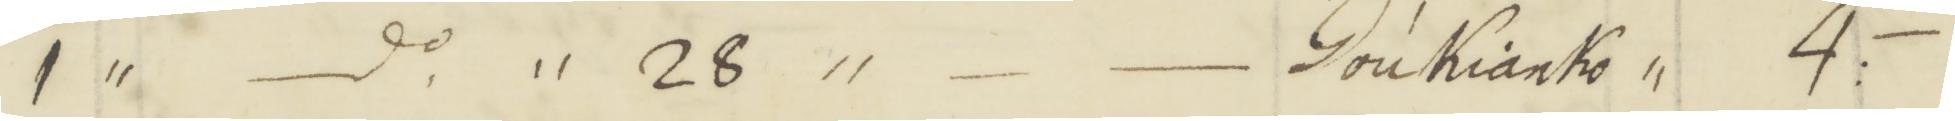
1 „ _:o „ 28 „ — — Goukianko „ 4:—
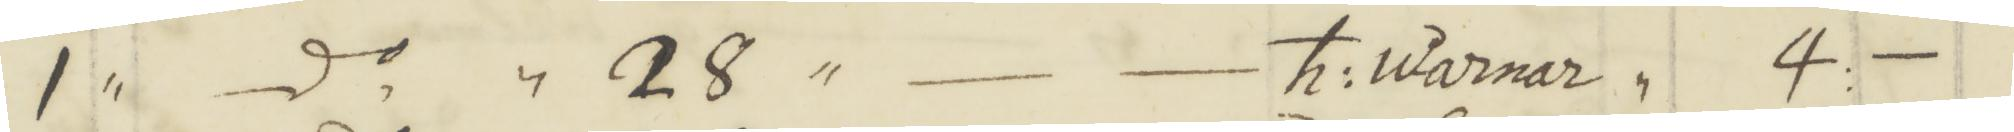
1 „ _:o „ 28 „ — — h: Warnar „ 4:—
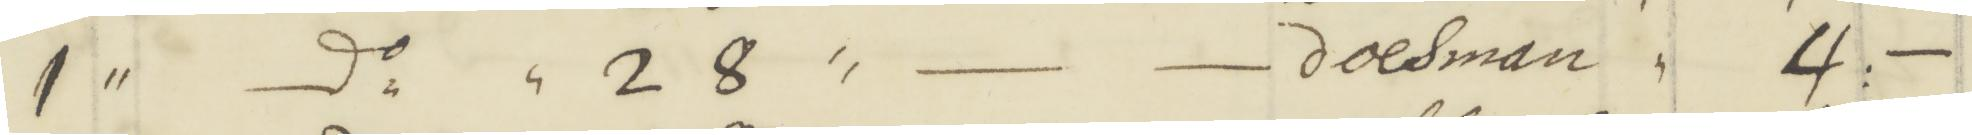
1 „ _:o „ 28 „ — — doesman. 4:—
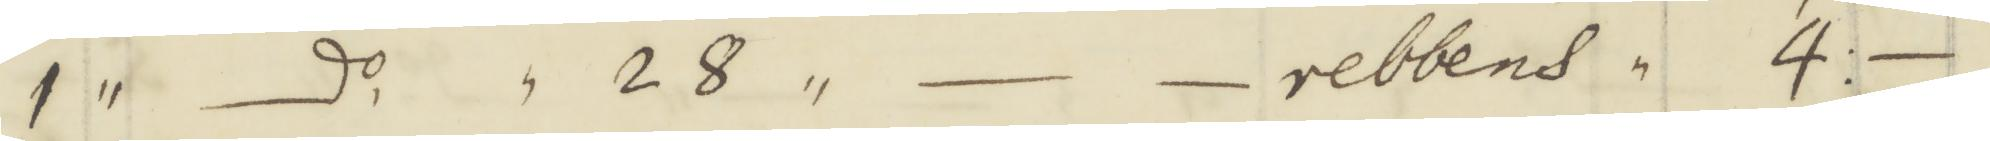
1 „ _:o „ 28 „ — — rebbens „ 4:—
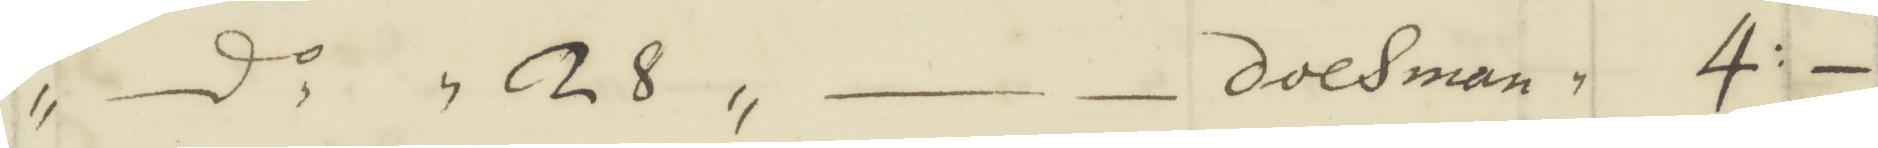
1„ _:o „ 28 „ — — doesman„ 4:—
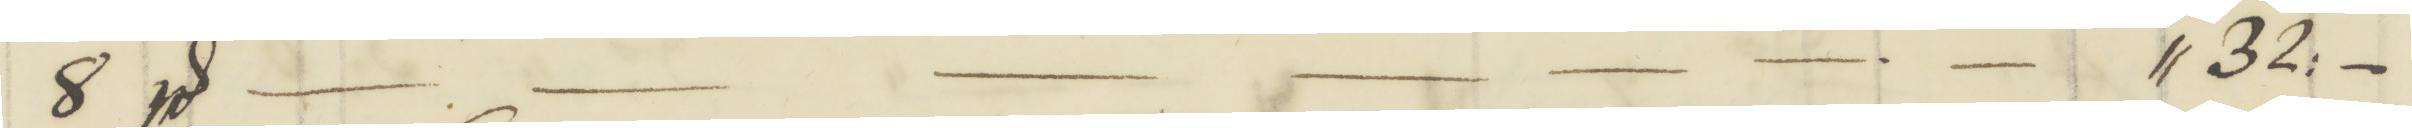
8 ps — — — — — —. — „32:—
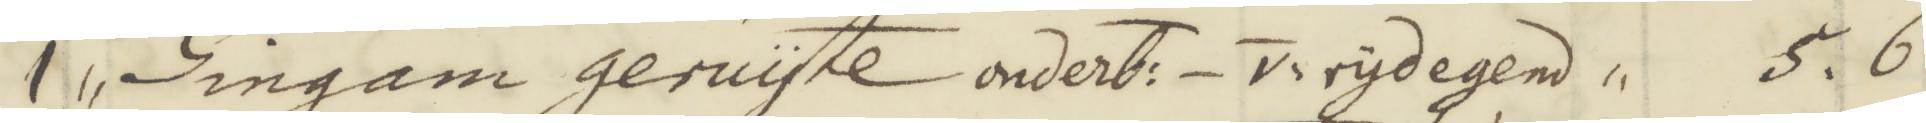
1.„ Gingam geruijte onderb: — v: rijdegend „ 5.6
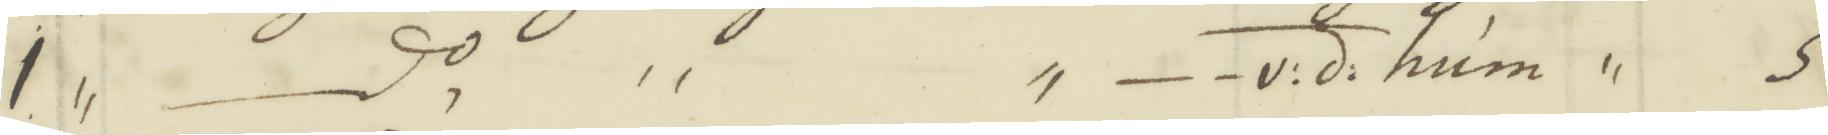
1.„ _,o „ „ — - v: d: hum „ 5
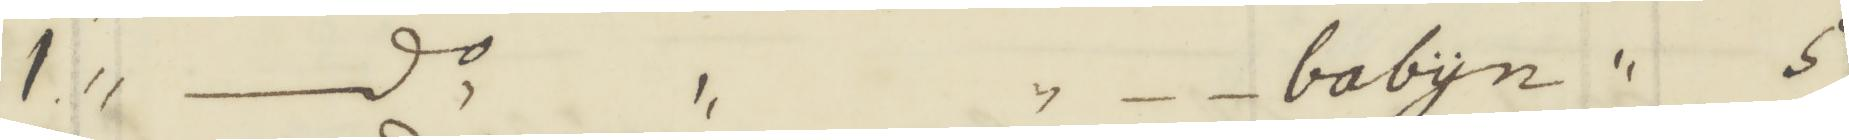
1.„ _,o „ „ — - babijn „ 5
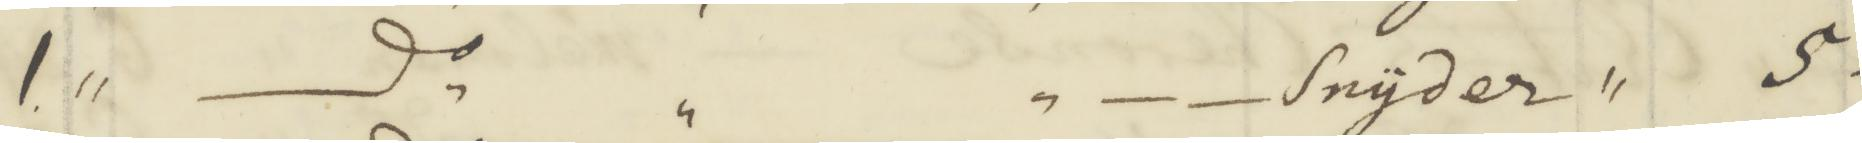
1.„ _,o „ „ — — snijder„ 5
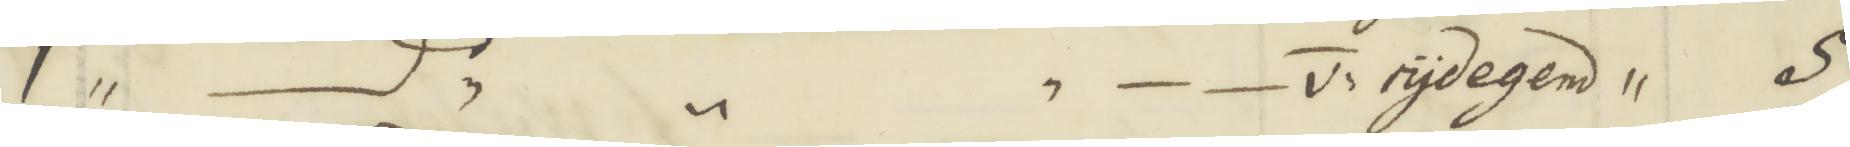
1.„ _,o „ „ — — v: rijdegend „ 5
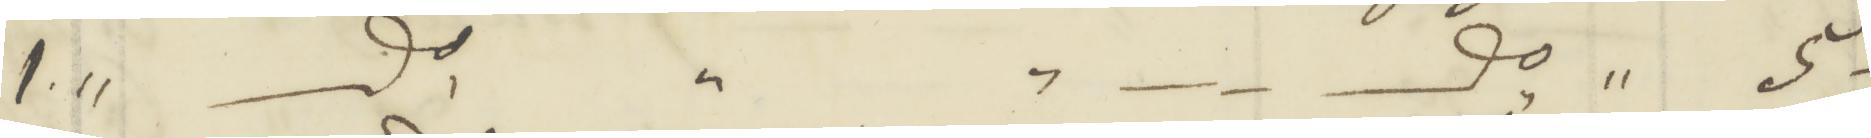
1. „ _,o „ „ — — _,o „ 5:
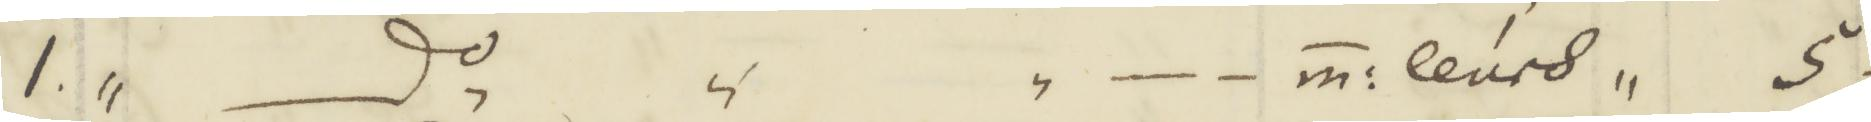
1. „ _,o „ „ — - m: leurs„ 5.
